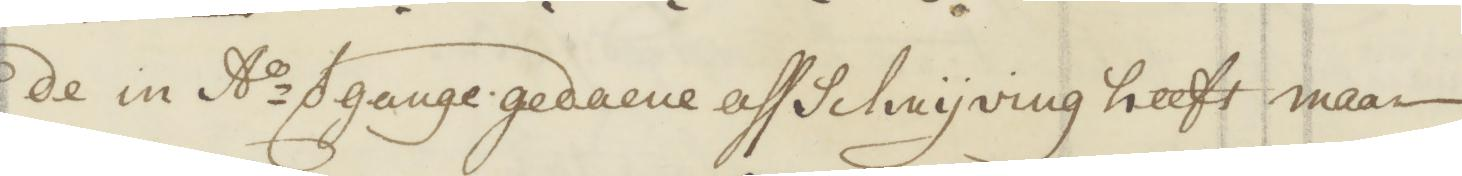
de in A=o vergange gedaene affschrijving heeft maar
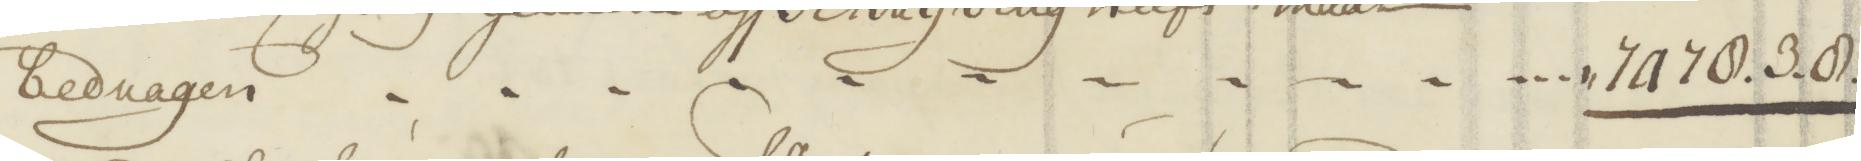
bedragen - - - - - – – – – – - - - „ 7478.3.8
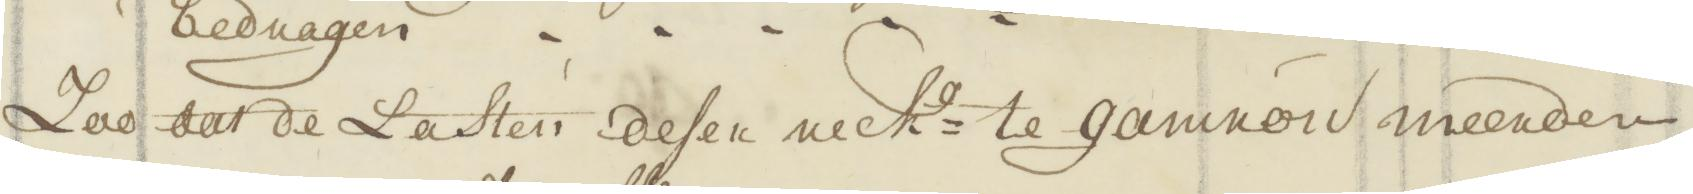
Zoo dat de Lasten deser reek=g te gamron meerder
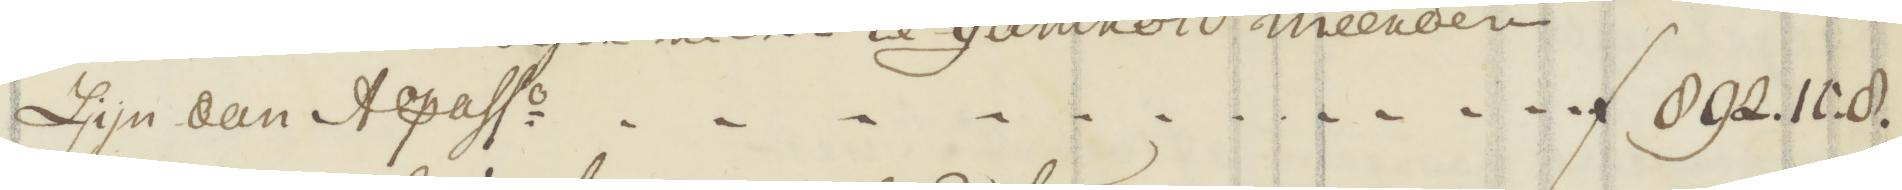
zijn dan Ao pass=o - – – – - - . . – – – - ƒ 892.15.8.
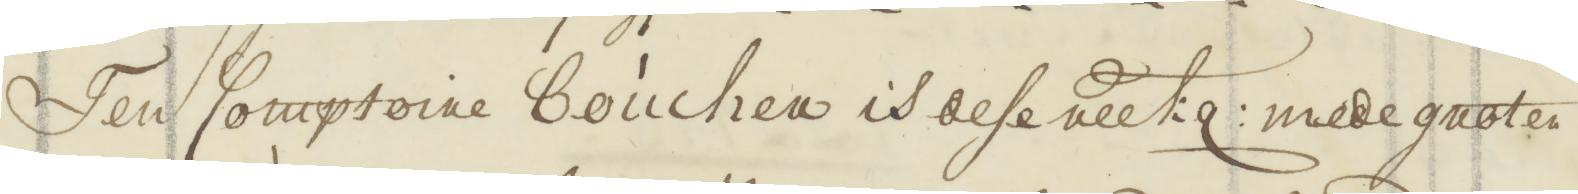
Ten Comptoire boucher is dese reekq: mede groter
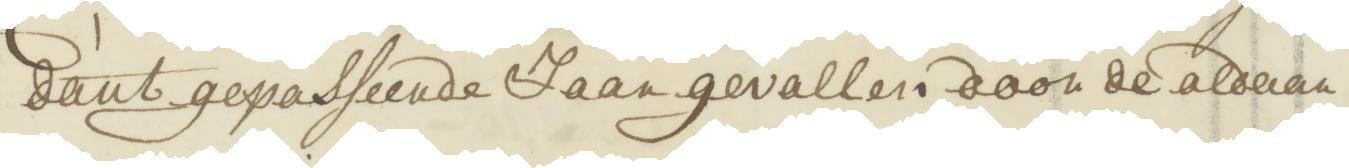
dan't gepasseerde Iaar gevallen door de aldaar
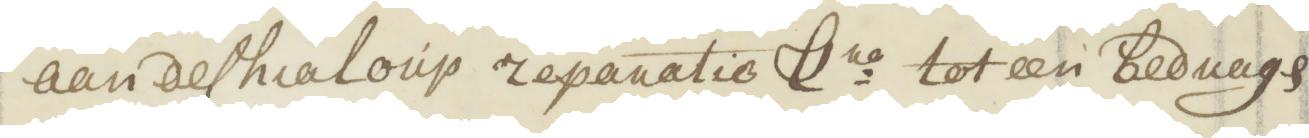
aan de Chialoup reparatie &=ra tot een bedragen
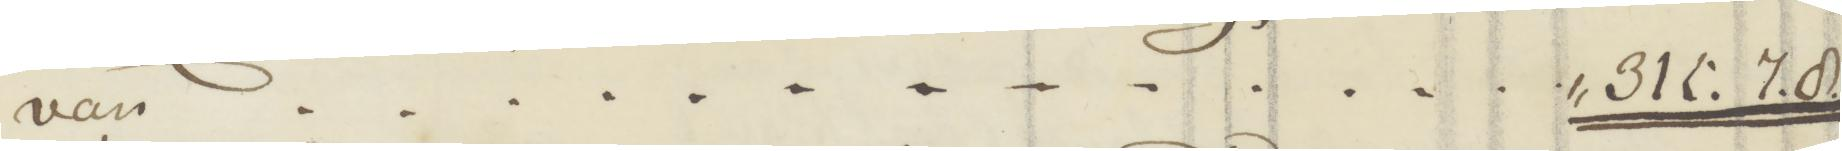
van - - - - - – – – – - - - . .„ 315. 7.8.
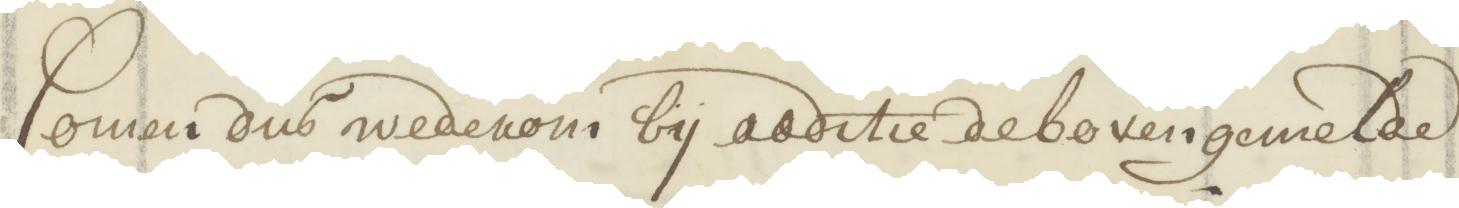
Comen dus wederom bij additie de boven gemelde
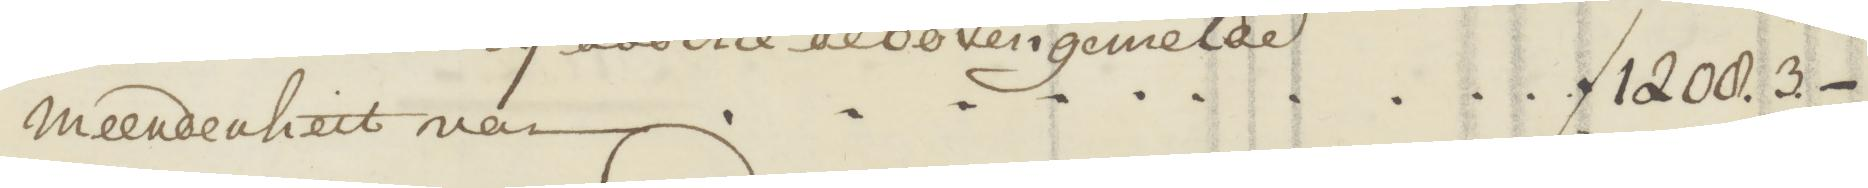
meerderheit van . - - - . . . . . . .ƒ1208. 3. –
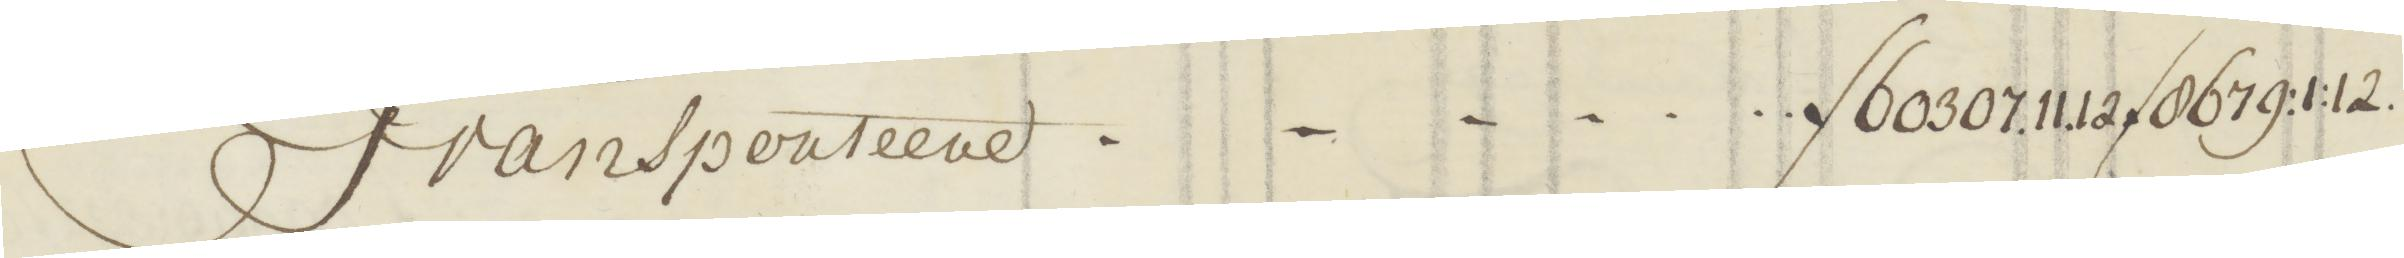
Transporteere - – – – - . . ƒ60307.11.12 ƒ8679:1:12.
